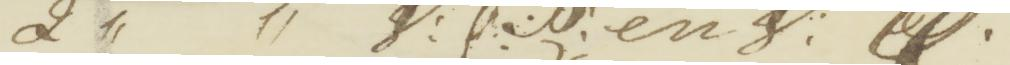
2 „ „ V: P: en V: Q:
